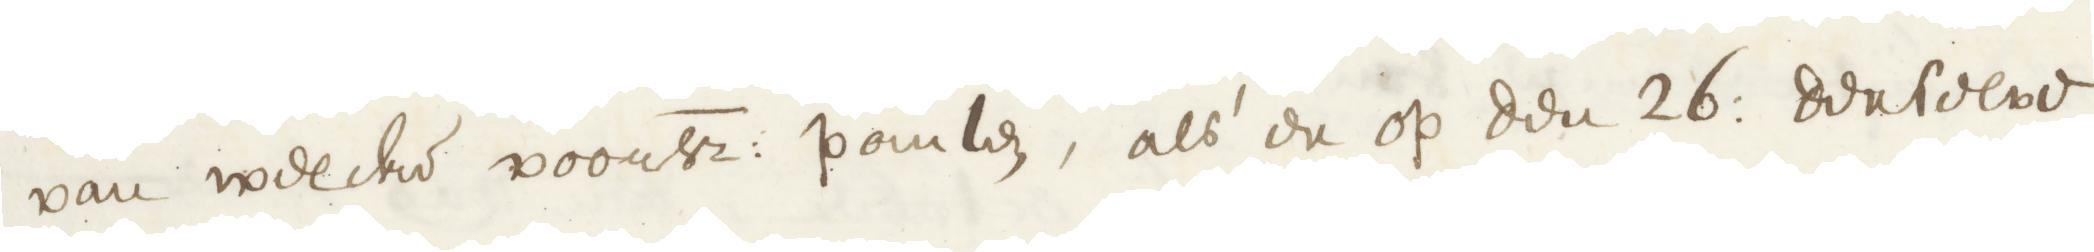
van welcke voorsz: pointen, als 'er op den 26: derselve
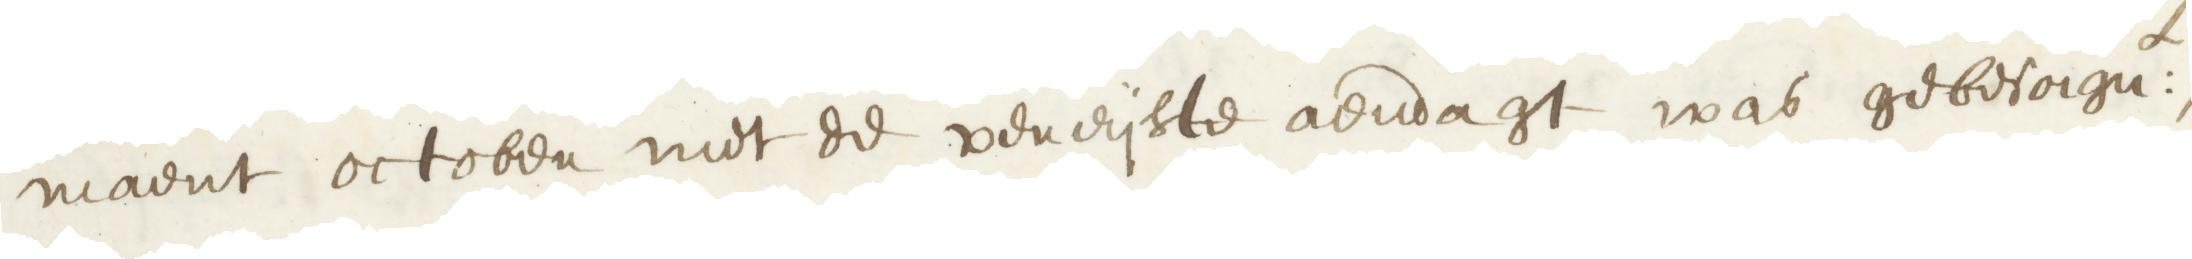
maent october met de vereijste aendagt was gebesoign:t,
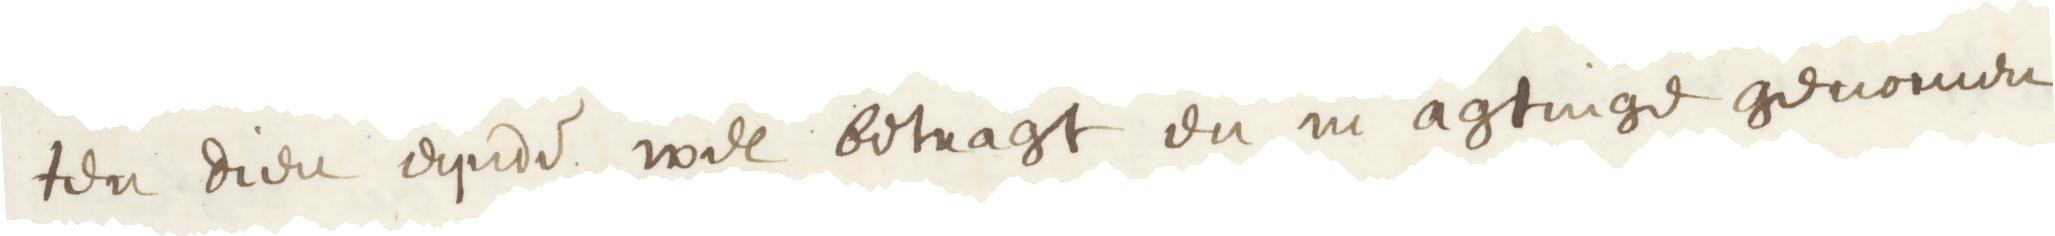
ten dien eijnde wel betragt en in agtinge genomen
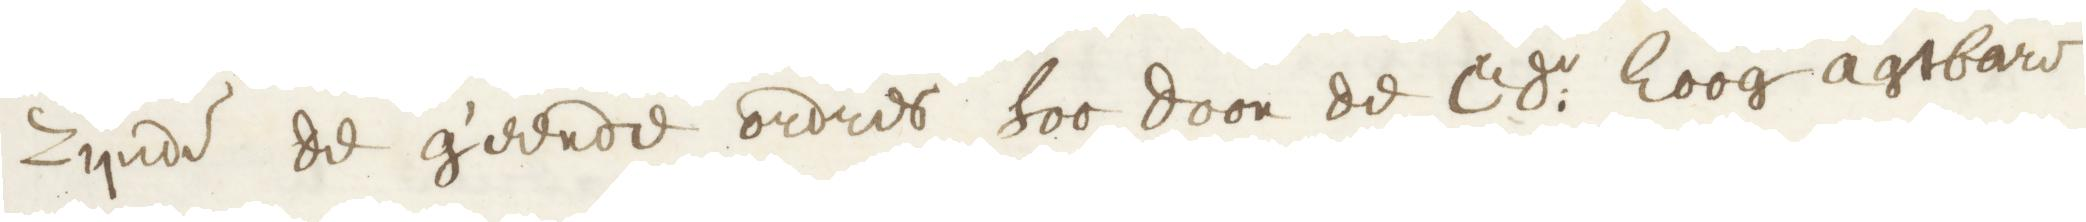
zijnde de g'eerde ordres soo door de Ed:e hoog agtbare
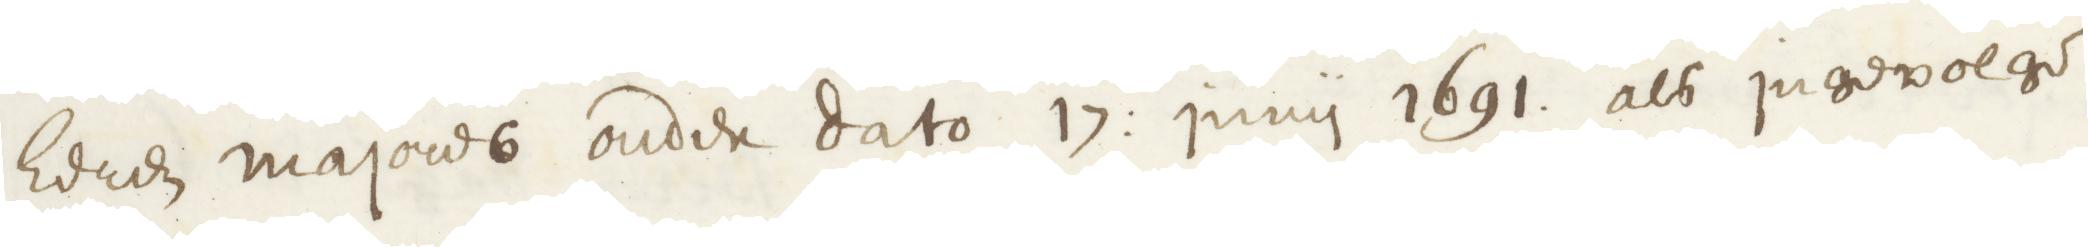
heren majores onder dato 17: junij 1691. als ingevolge
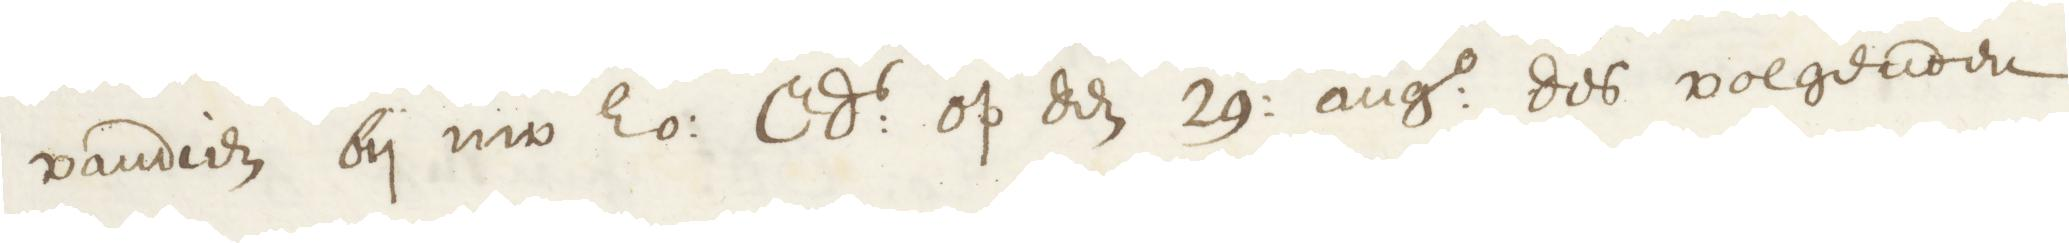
vandien bij uw ho: Ed:s op den 29: aug:o des volgenden
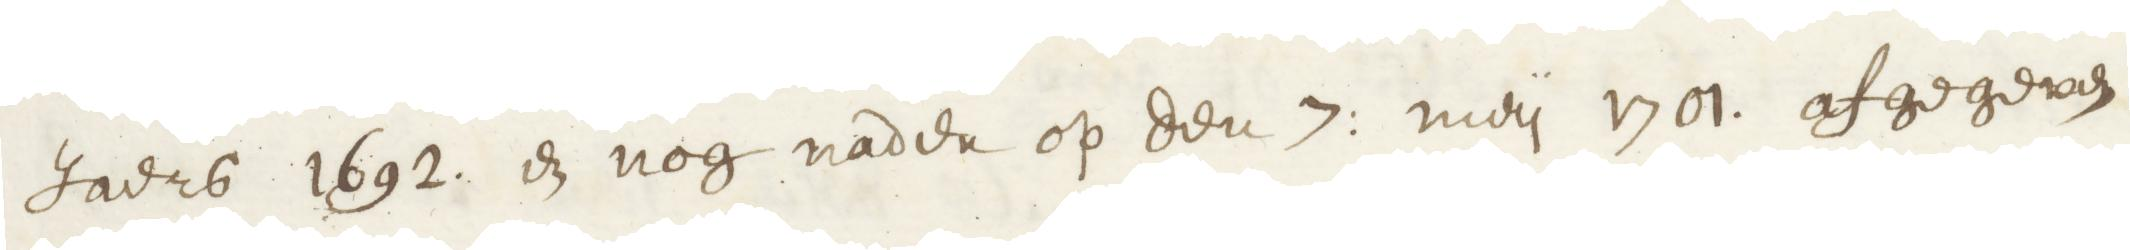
Iaers 1692. en nog nader op den 7: meij 1701. afgegeven
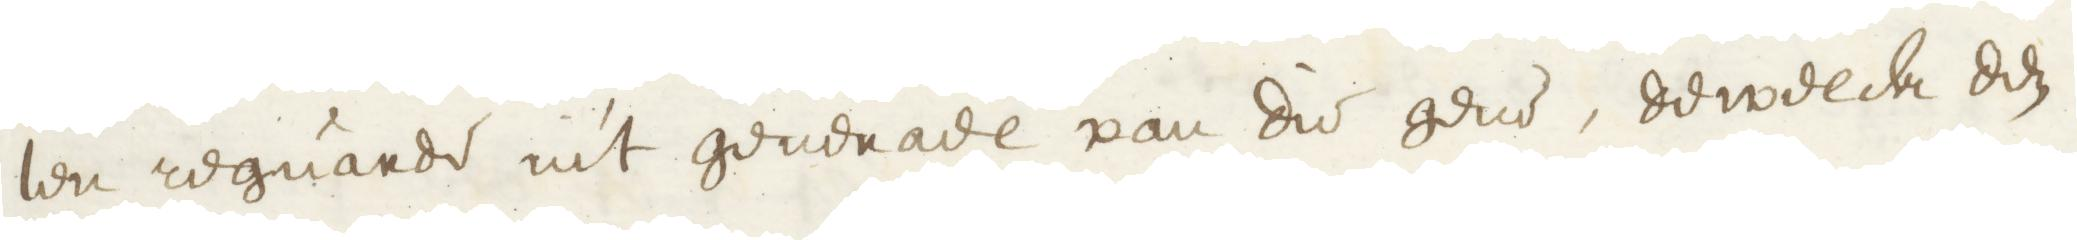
ten reguarde in’t generael van die gene, dewelck den
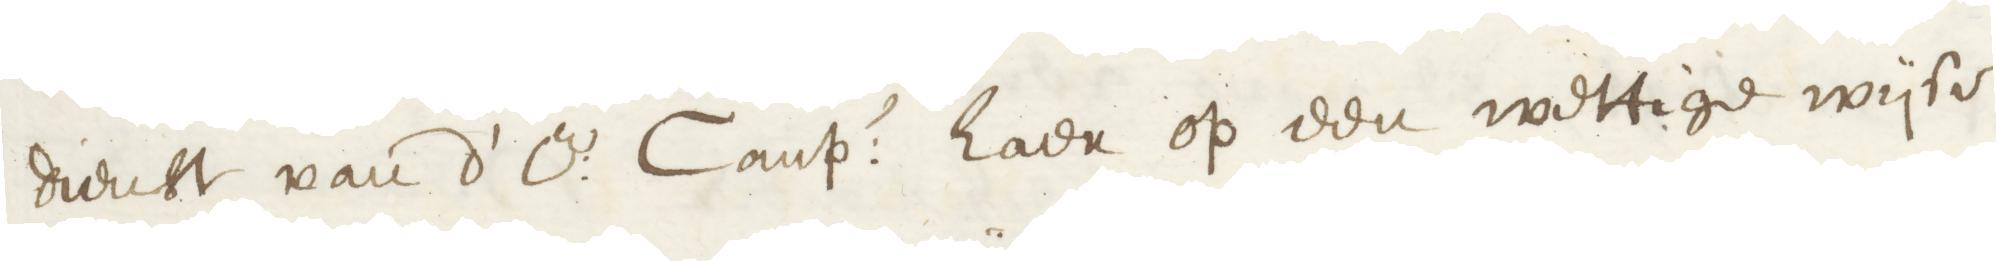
dienst van d’ E: Comp:' haer op een wettige wijse
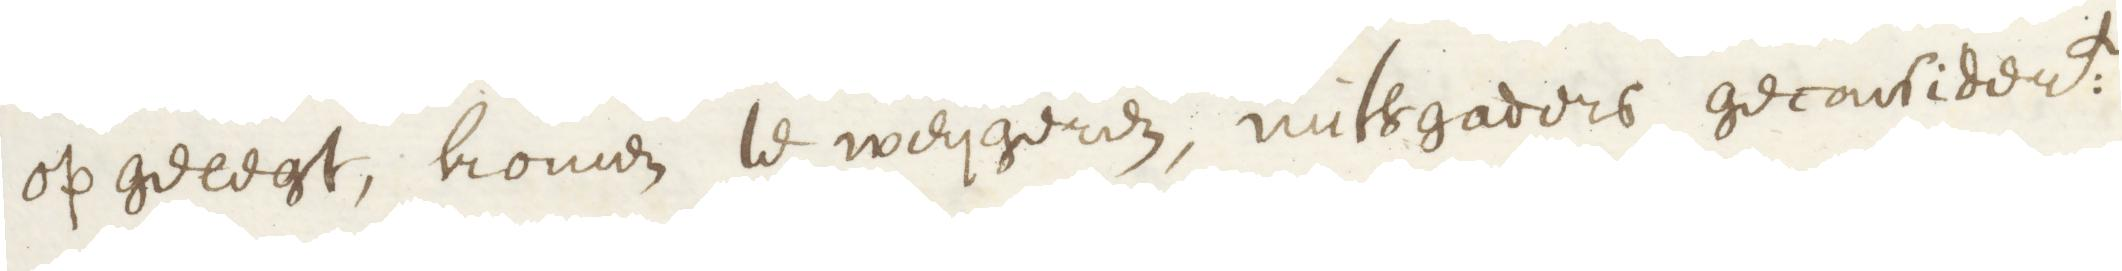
op gelegt, komen te weijgeren, mitsgaders geconsider:t
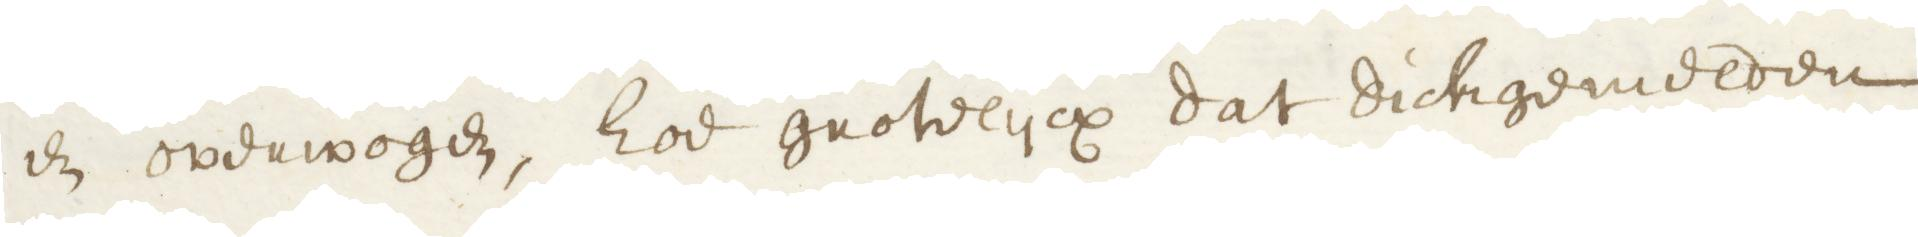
en overwogen, hoe grotelijcx dat dickgemelden
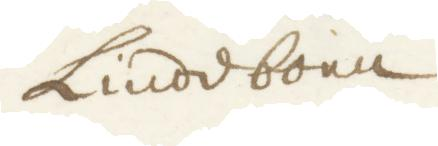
Lindeborn
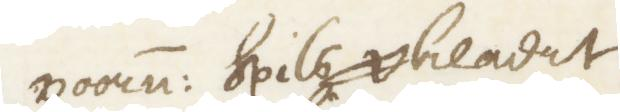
voorn: spils verklaert
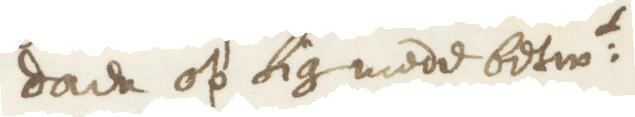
daer op sig mede besw:t
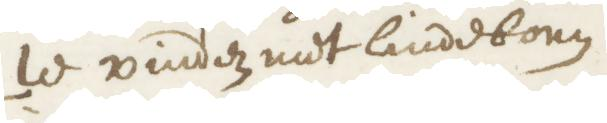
te vinden met lindeborn
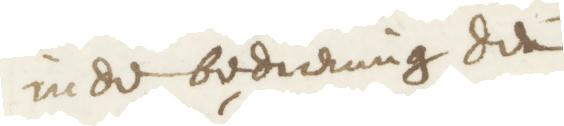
in de bediening der
